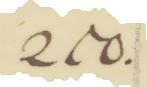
250.
